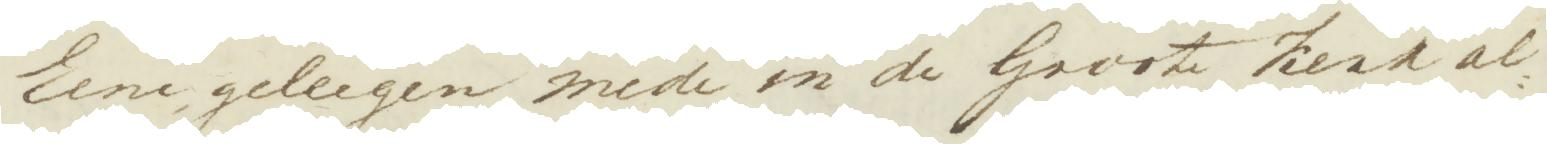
Eene geleegen mede in de Groote Kerk al„
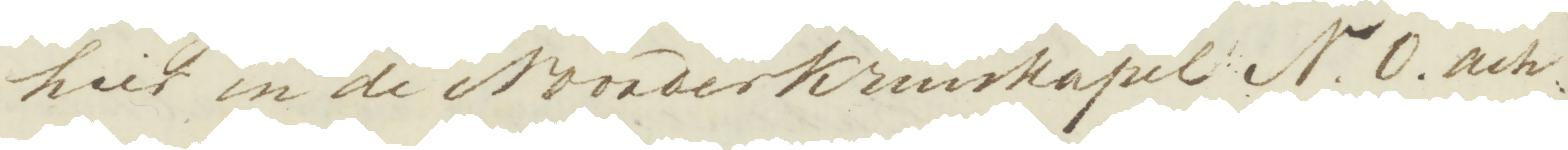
hier in de Noorder Kruiskapel N. O. ach
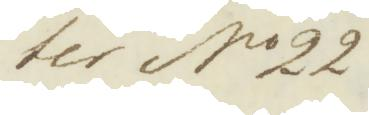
ter N.o 22
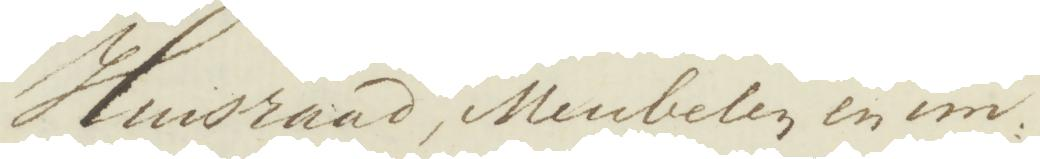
Huisraad, Meubelen en im„
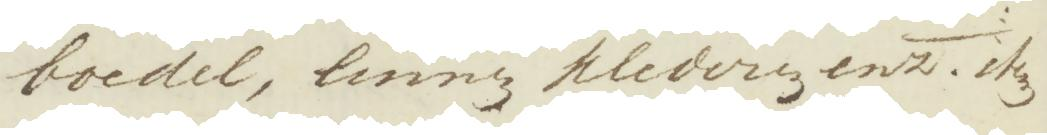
boedel, linnen klederen enz. item
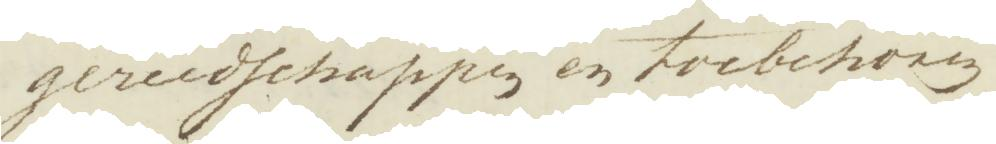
gereedschappen en toebehoren
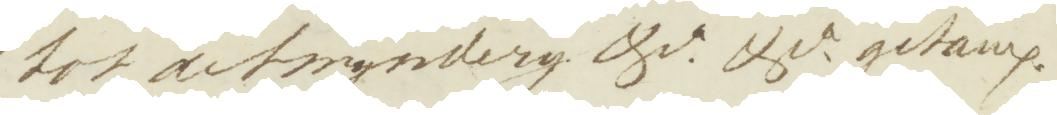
tot de twyndery &c.a &c.a getaux„
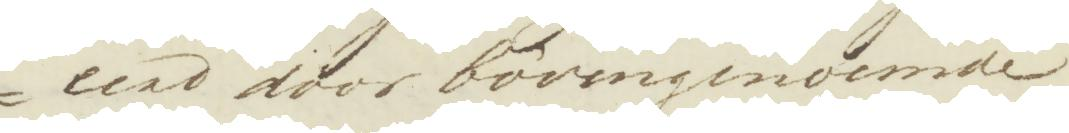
„eerd door bovengenoemde
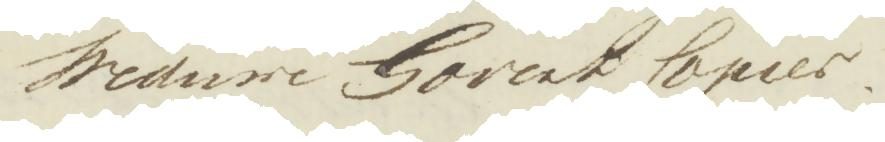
Weduwe Govert Copier.
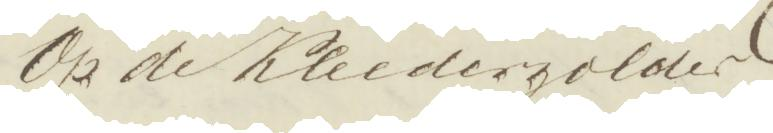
Op de Kleederzolder
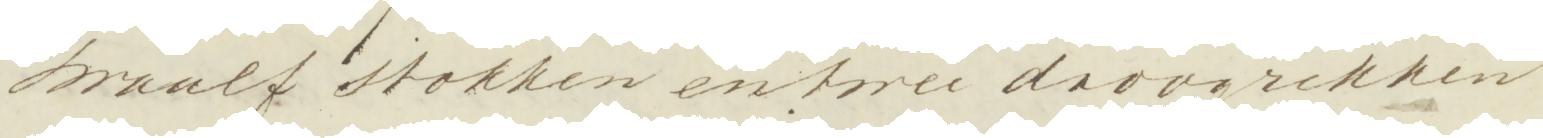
Twaalf stokken en twee droogrekken
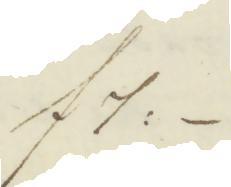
ƒ 7: —
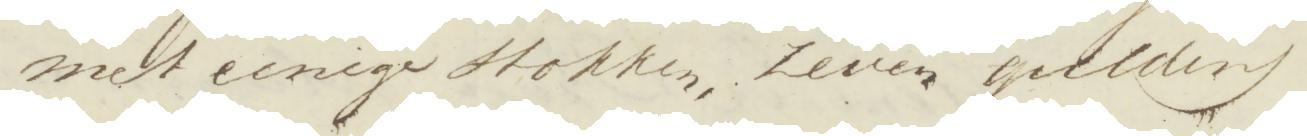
met eenige stokken, zeven guldens
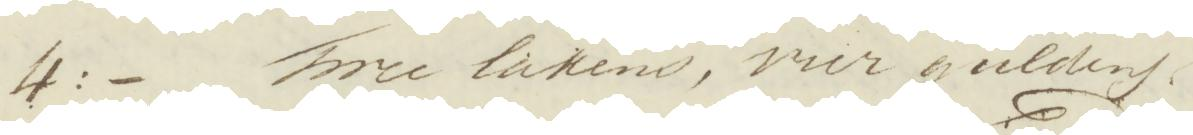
4: — Twee lakens, vier guldens.
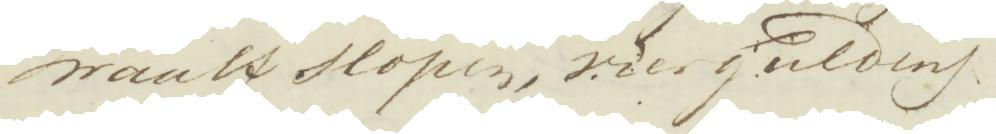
Twaalf slopen, vier guldens.
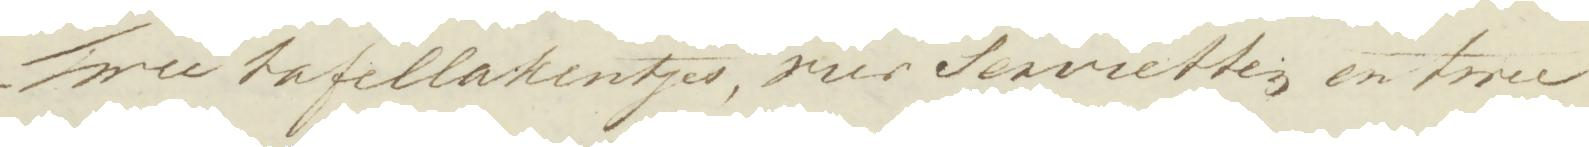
Twee tafellakentjes, vier servietten en twee
